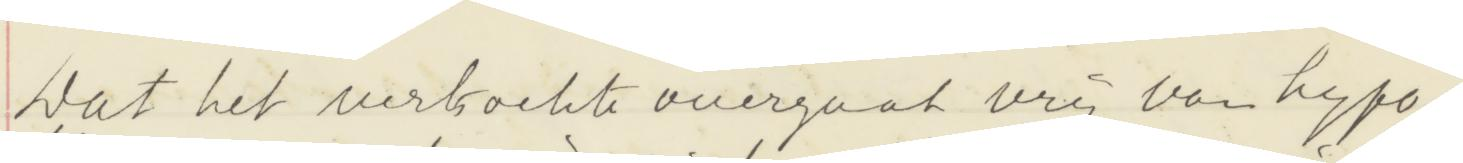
dat het verkochte overgaat vrij van hypo-
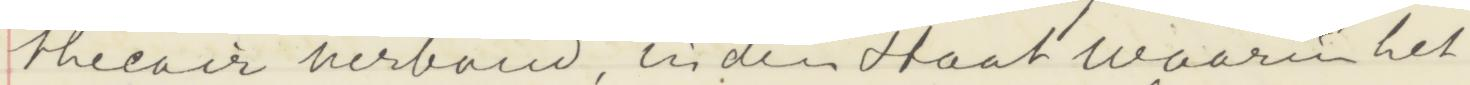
thecair verband, in den staat waarin het
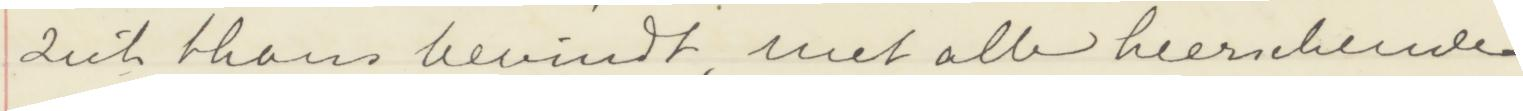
zich thans bevindt, met alle heerschende
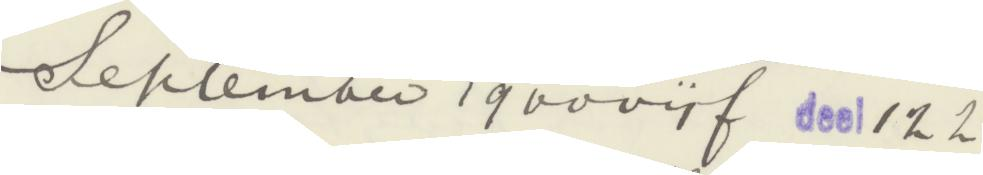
September 1900vijf deel 122
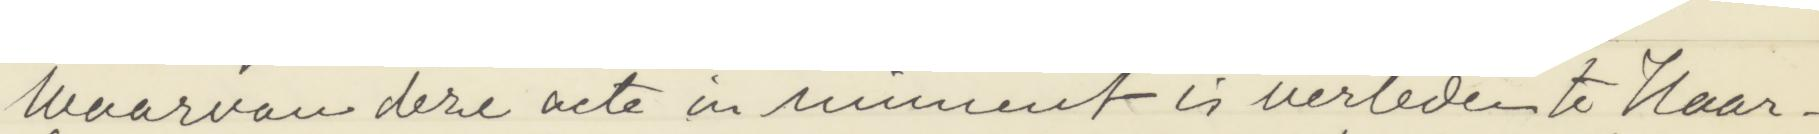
waarvan deze acte in minuut is verleden te Haar-
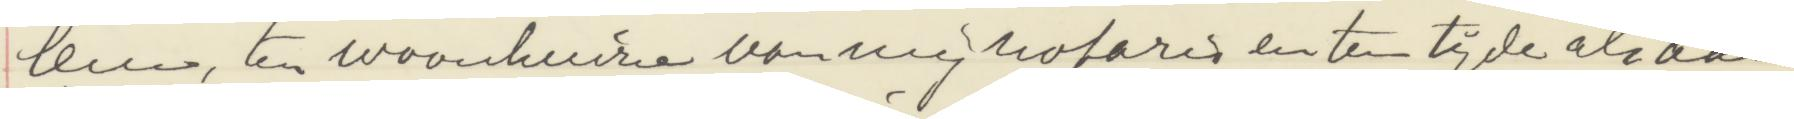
lem, ten woonhuize van mij notaris en ten tijde als aan
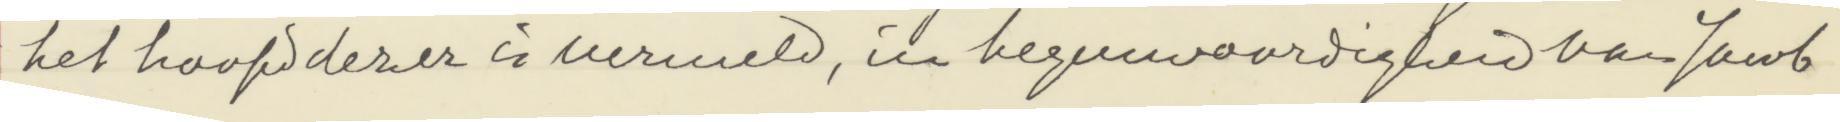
het hoofd dezer is vermeld, in tegenwoordigheid van Jacob
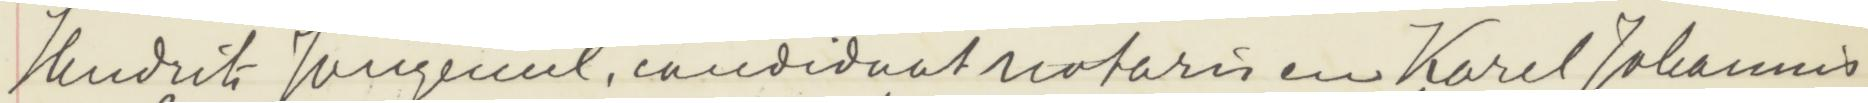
Hendrik Jongeneel, candidaat notaris en Karel Johannes
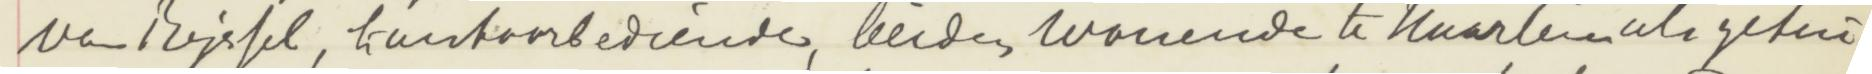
van Rijssel, kantoorbediende, beiden wonende te Haarlem als getui
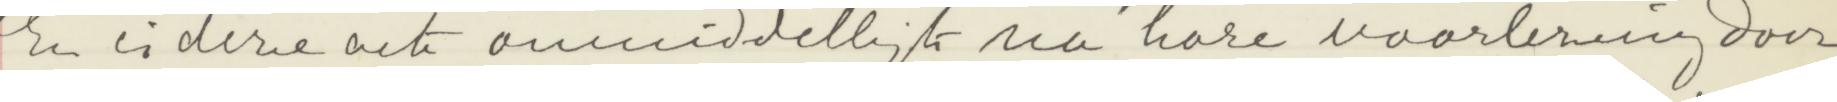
En is deze acte ommiddellijk na hare voorlezing door
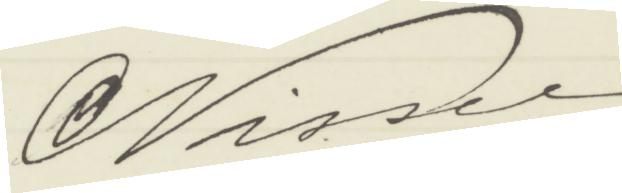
CVisser
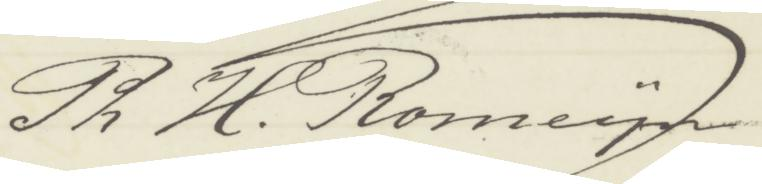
Ph H. Romeijn
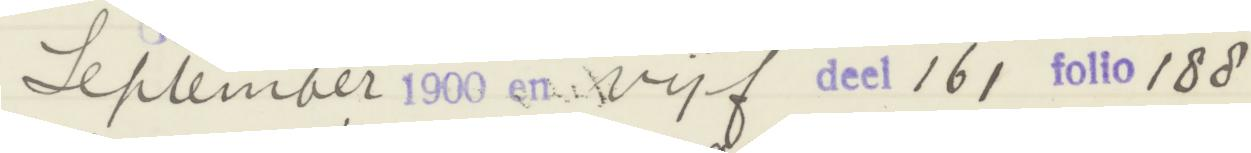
September 1900 en vijf deel 161 folio 188
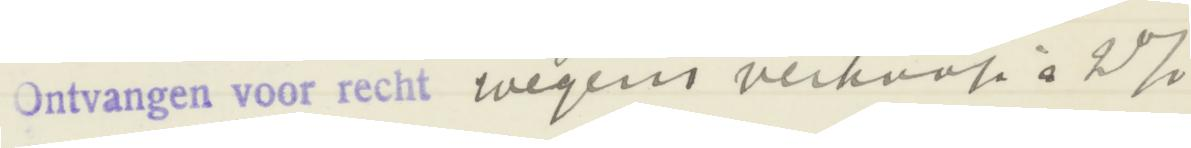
wegens verkoop à 2%
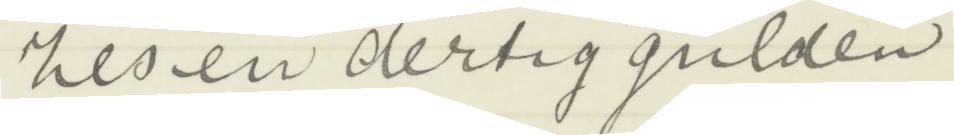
zes en dertig gulden
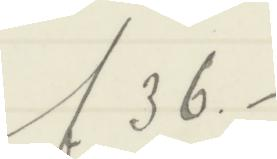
ƒ 36.-
